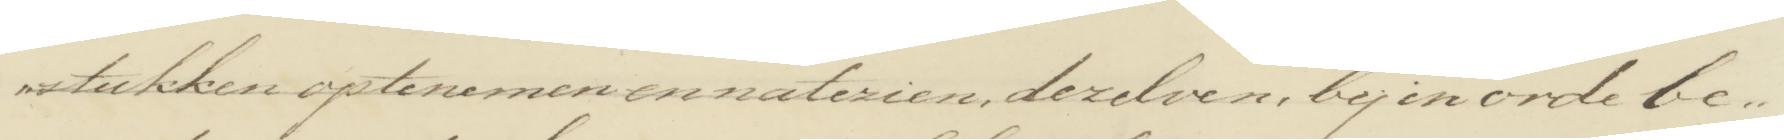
stukken optenemen en natezien, dezelven, bij in orde be„
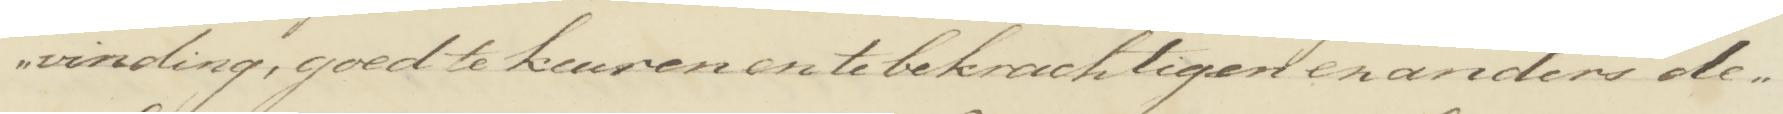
„vinding, goed te keuren en te bekrachtigen en anders de„
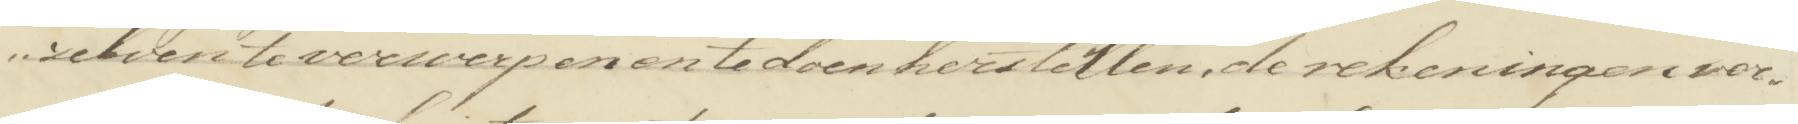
„zelven te verwerpen en te doen herstellen, de rekeningen ver„
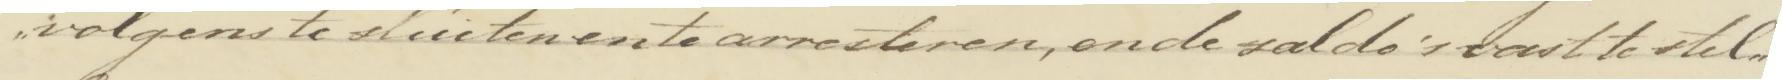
„volgens te sluiten en te arresteren, ende zaldo's vast te stel
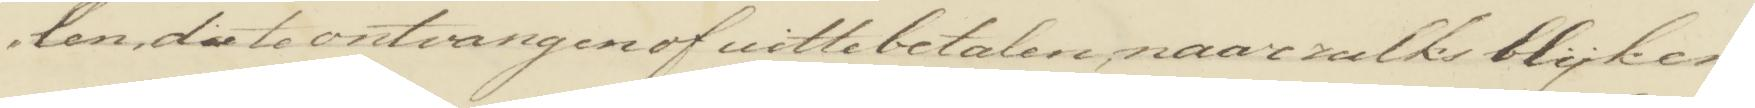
„len, die te ontvangen of uittebetalen, naar zulks blijken
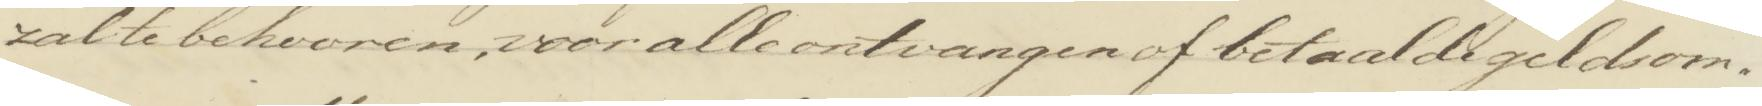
zal te behooren, voor alle ontvangen of betaalde geldsom„
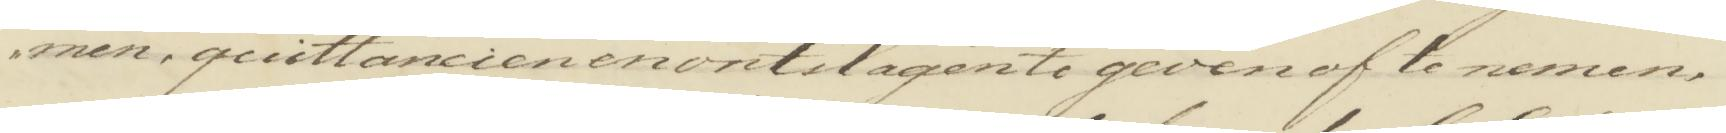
„men, quittancien en ontslagen te geven of te nemen,
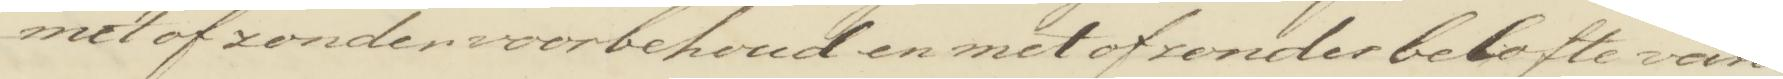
met of zonder voorbehoud en met of zonder belofte van
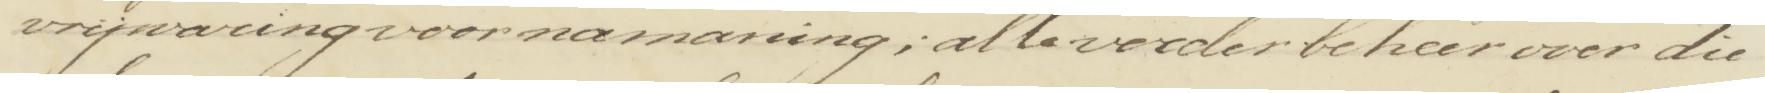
vrijwaring voor namaning; alle verder beheer over die
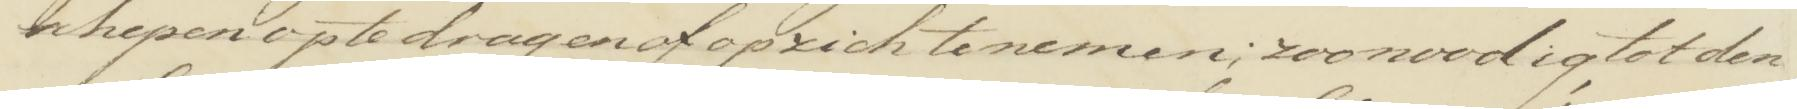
schepen op te dragen of op zich tenemen; zoo noodig tot den
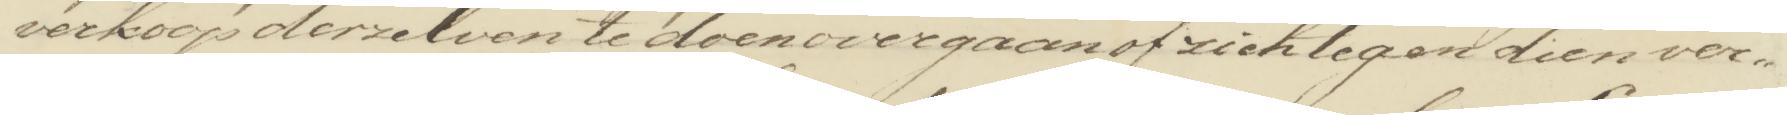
verkoop derzelven te doen overgaan of zich tegen dien ver„
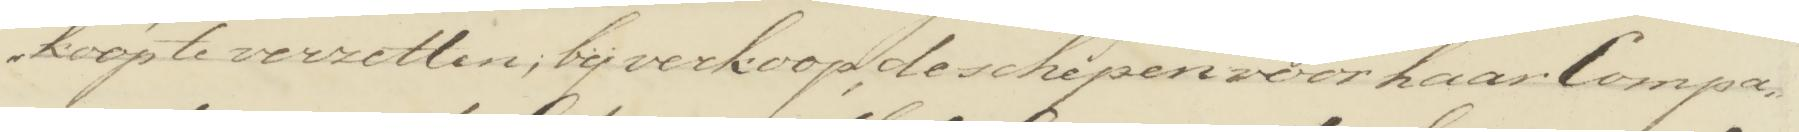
„koop te verzetten; bij verkoop, de schepen voor haar Compa„
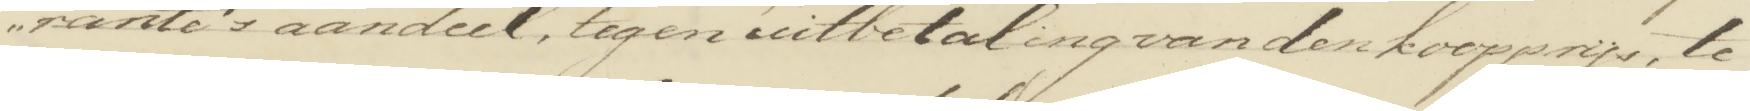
„rante's aandeel, tegen uitbetaling van den koopprijs, te
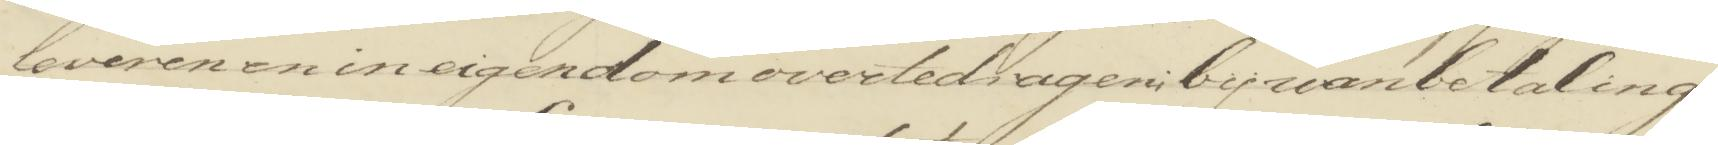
leveren en in eigendom over tedragen bij wanbetaling
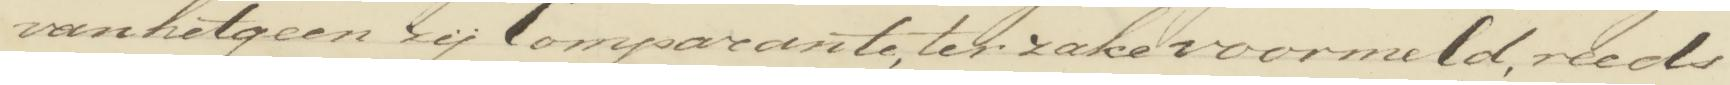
van hetgeen zij Comparante, ter zake voormeld, reeds
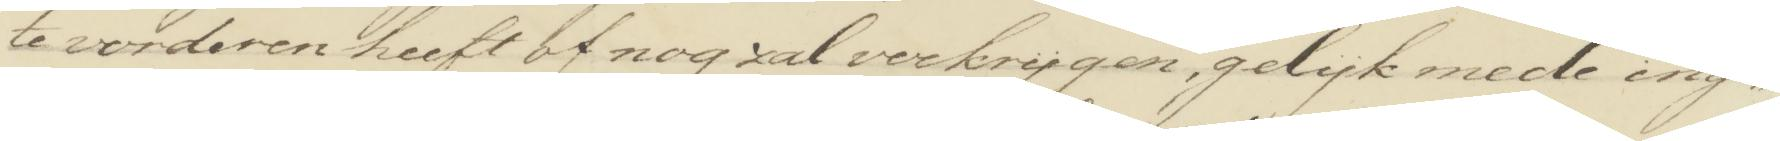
te vorderen heeft of nog zal verkrijgen, gelijk mede inge„
